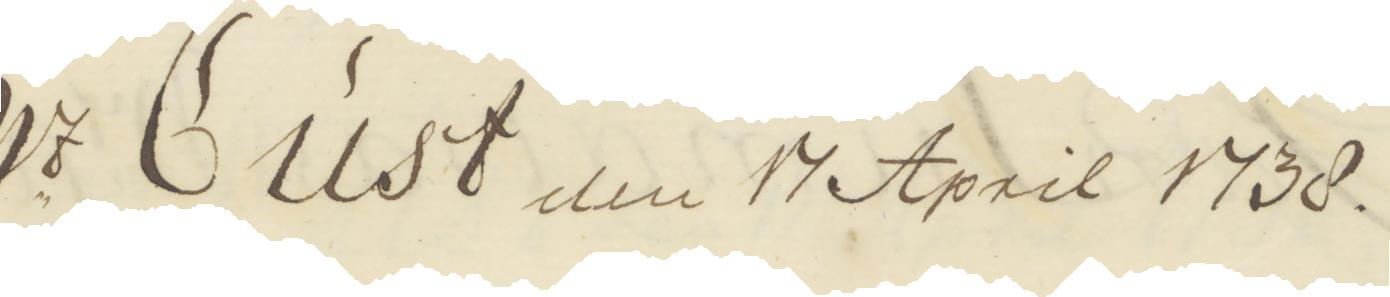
Van Sumatras W„t Cust den 17 April 1738.
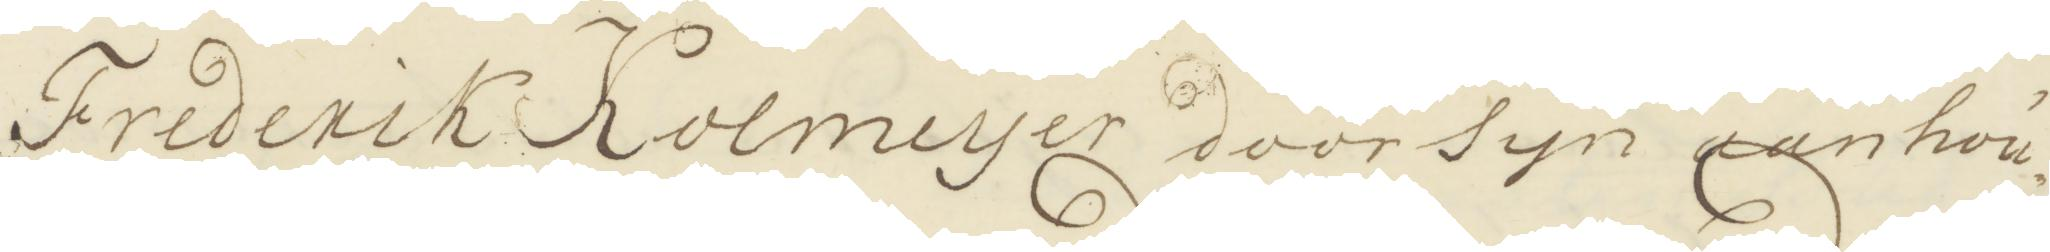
Frederik Kolmeijer door sijn aanhou„
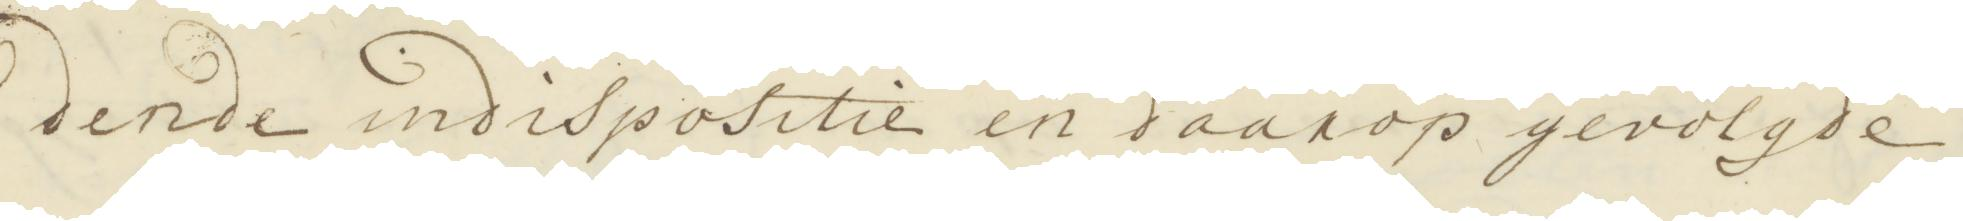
dende indispositie en daarop gevolgde
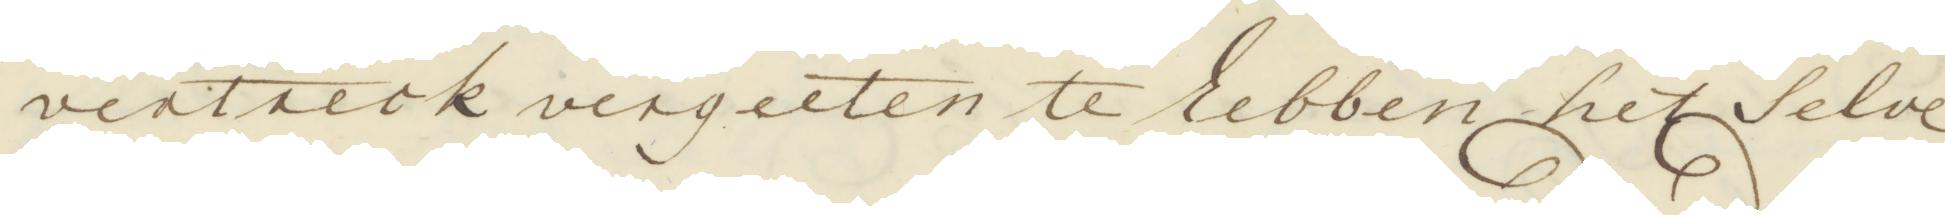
vertreck vergeeten te hebben het selve
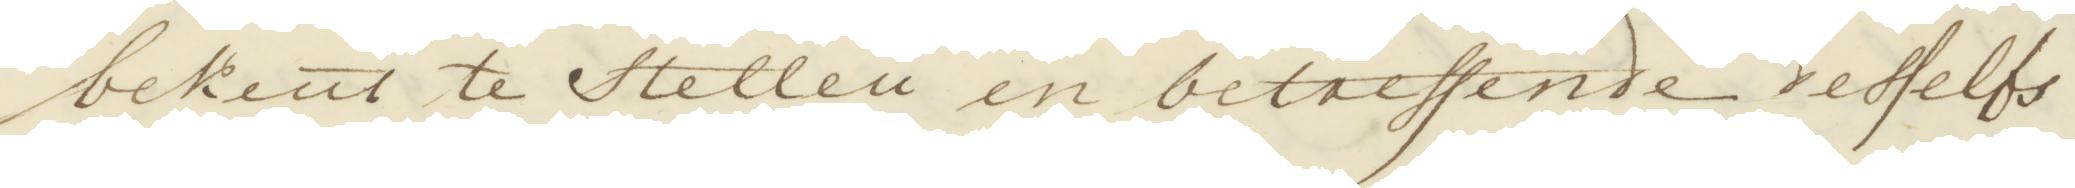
bekent te stellen en betreffende desselfs
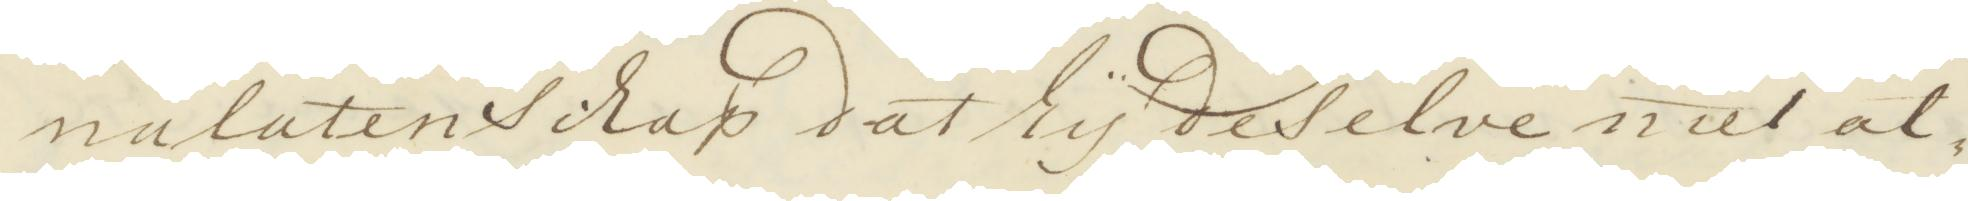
nalatenschap dat hij deselve niet al„
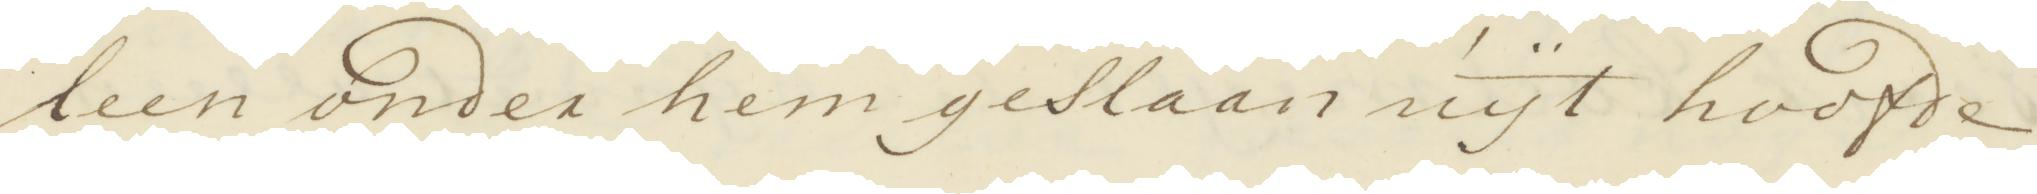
leen onder hem geslaan uijt hoofde
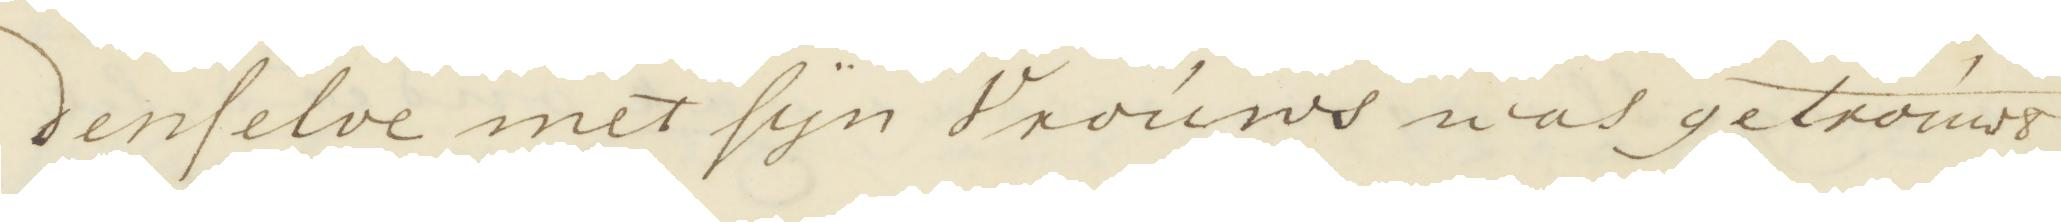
denselve met sijn vrouws was getrouwd
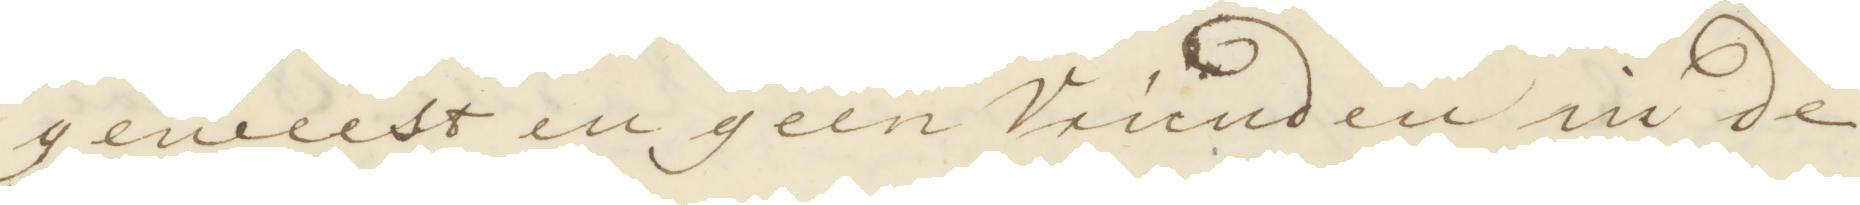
geweest en geen vrienden in de
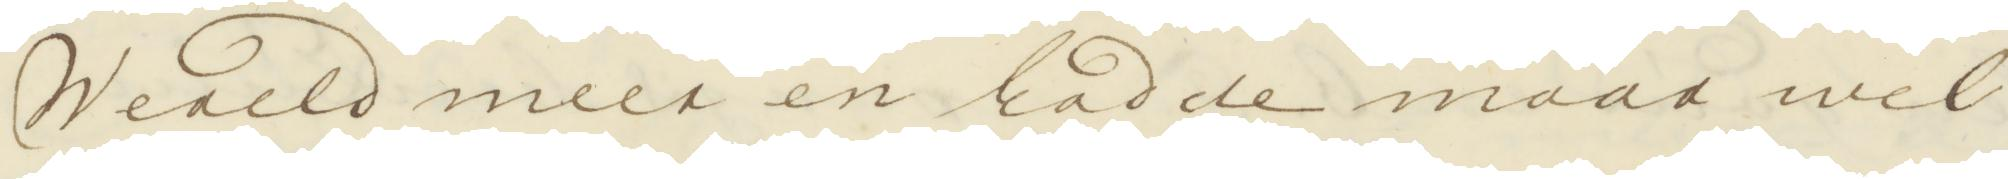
wereld meer en hadde maar wel
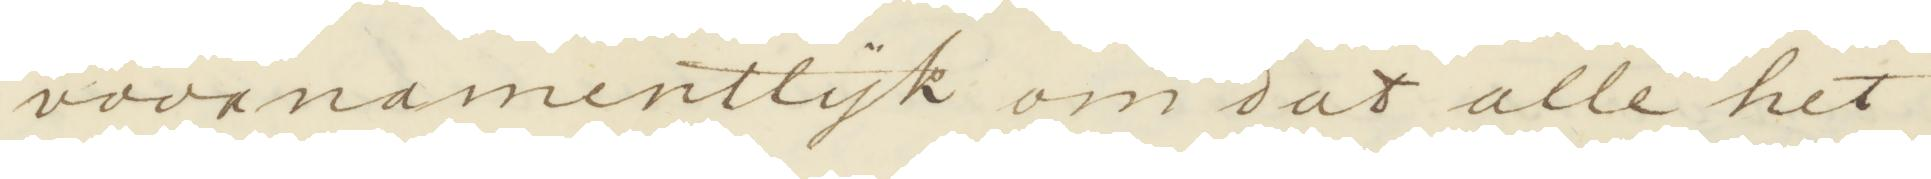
voornamentlijk om dat alle het
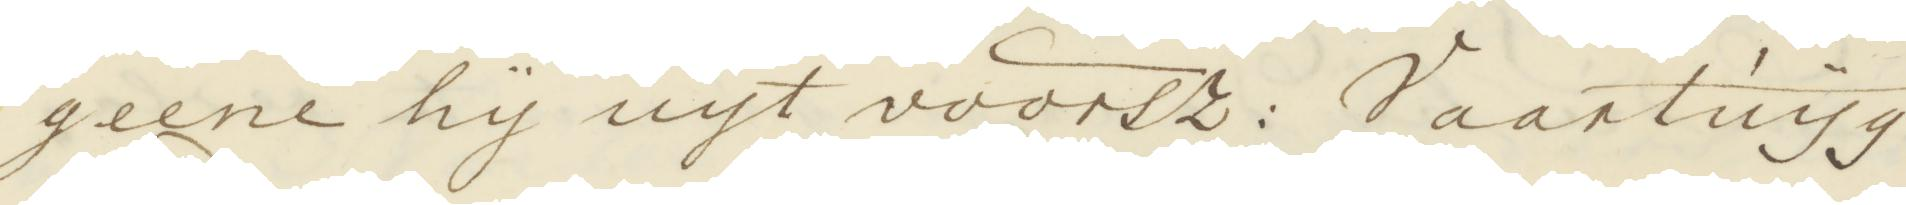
geene hij uijt voorsz: vaartuijg
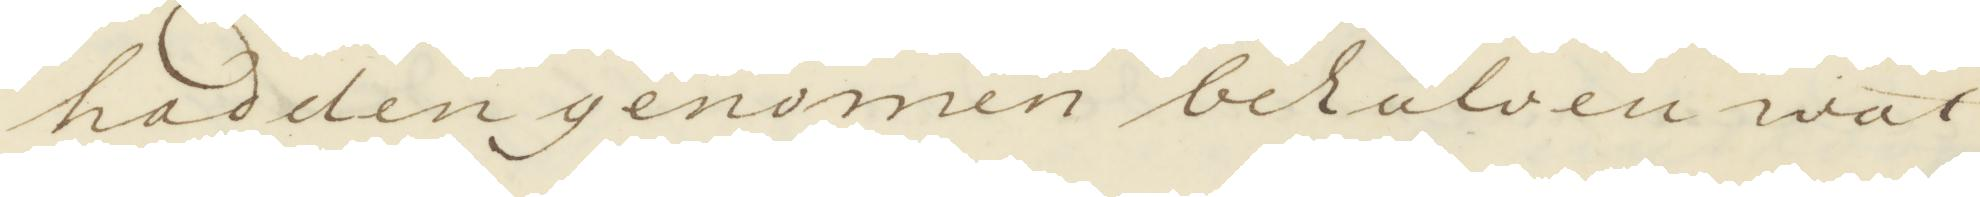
hadden genomen behalven wat
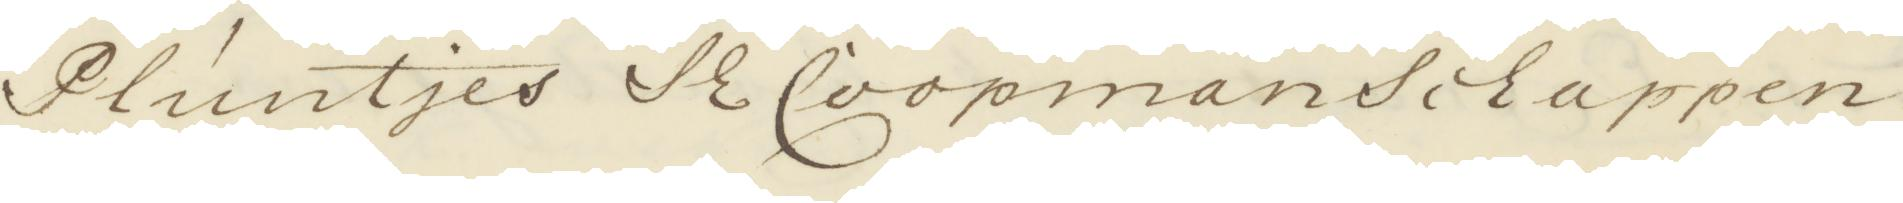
Pluntjes SE Coopmanschappen
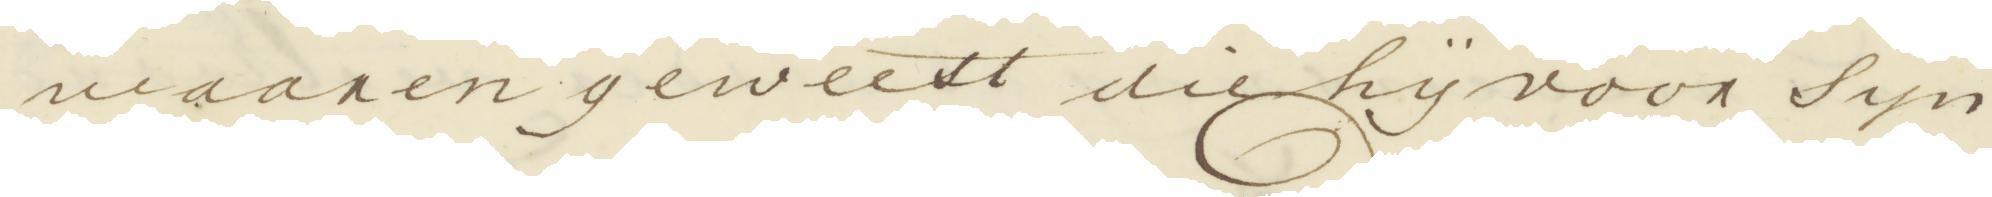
waaren geweest die hij voor sijn
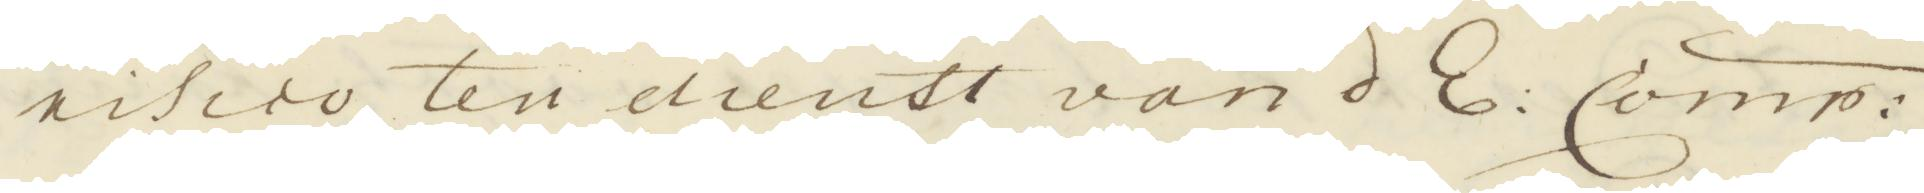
risico ten dienst van d E: Comp:
